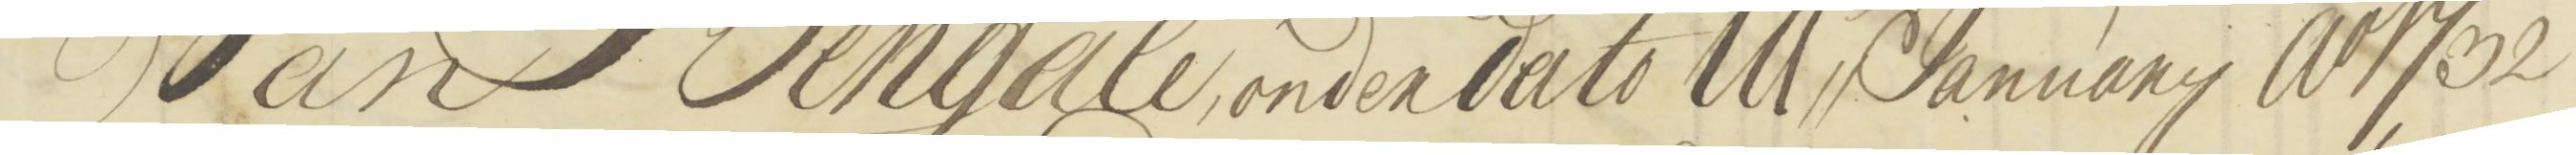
Van Bengale, onder dato 14„e Ianuarij Ao 1732
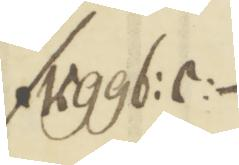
ƒ15996:5:—
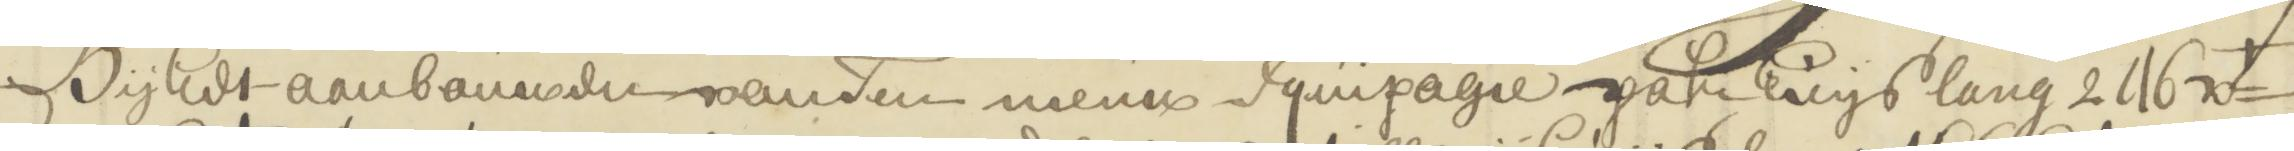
Bij het aanbouwen van Een nieuw Equipagie pakhuijs lang 246 v=t
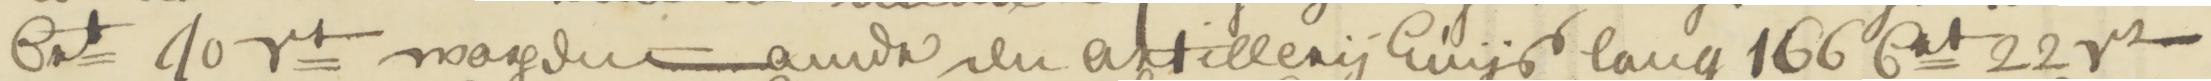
br=t 40 v=t wapen Camer en attillerij huijs lang 166 b=rt 22 v:t
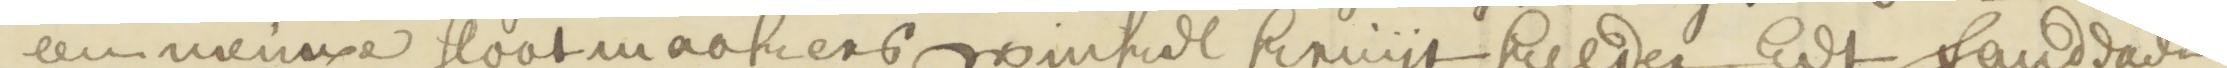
een nieuwe slootmaakers winkel kruijt kelder het veranderen
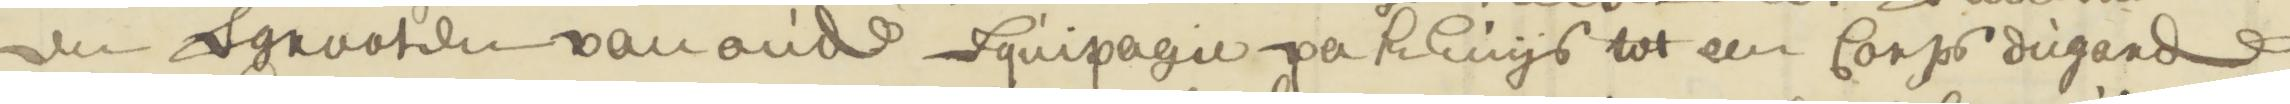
en vergooten van oude Equipagie pakhuijs tot een Corps dugarde
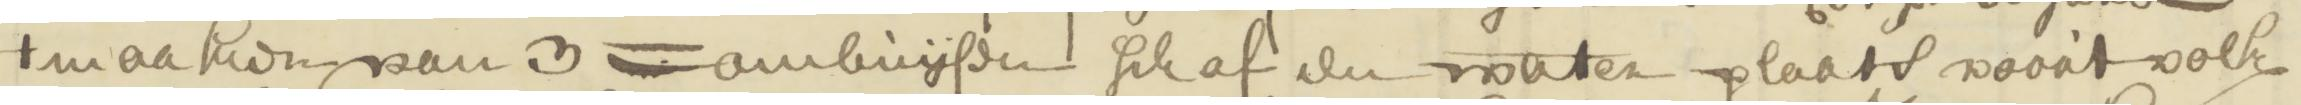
t maaken van 3 Combuijsen schaf en water plaats voor't volk
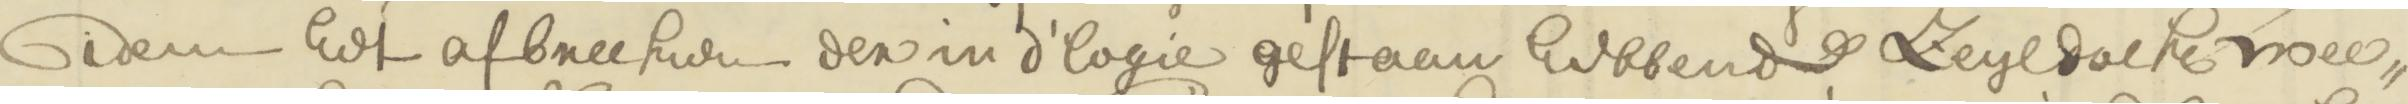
idem het afbreeken der in d’logie gestaan hebbende Zeyldoek wee„
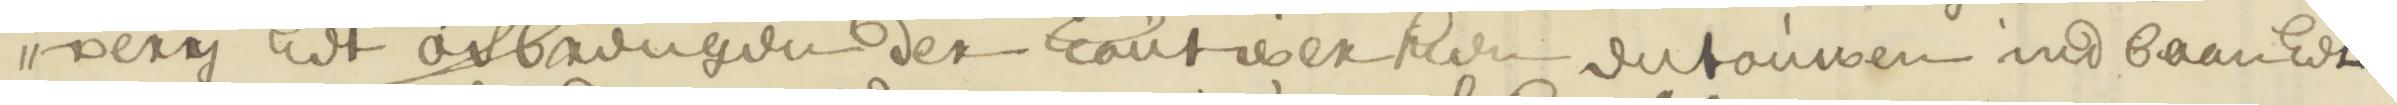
„verij het overbrengen der houtwerken entouwen ind baan het
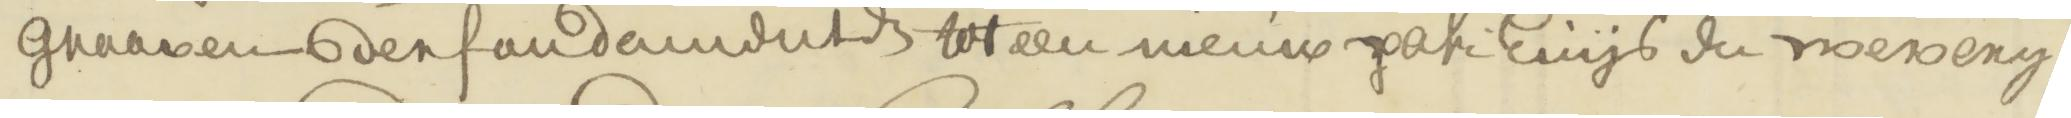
graaven der fondamenten tot een nieuw pakhuijs en wevery
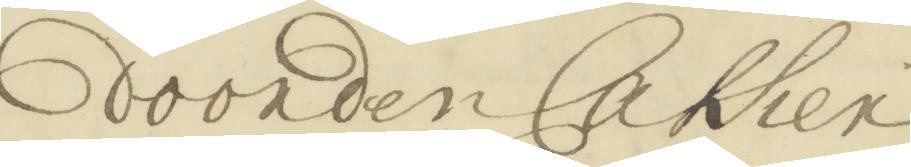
door den Cassier
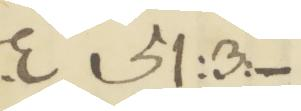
r 51:3:—
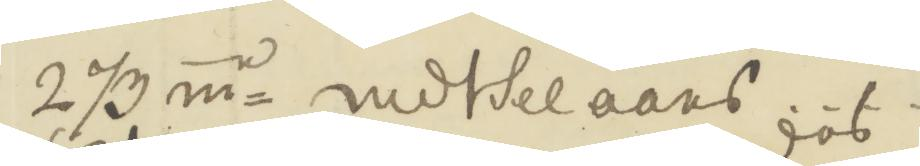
273 m=r metselaars
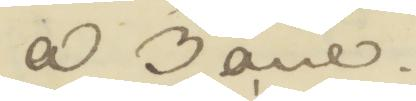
a 3 ane
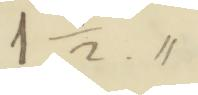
1½. „
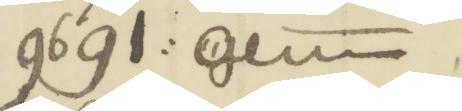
9691: gem. D:os
